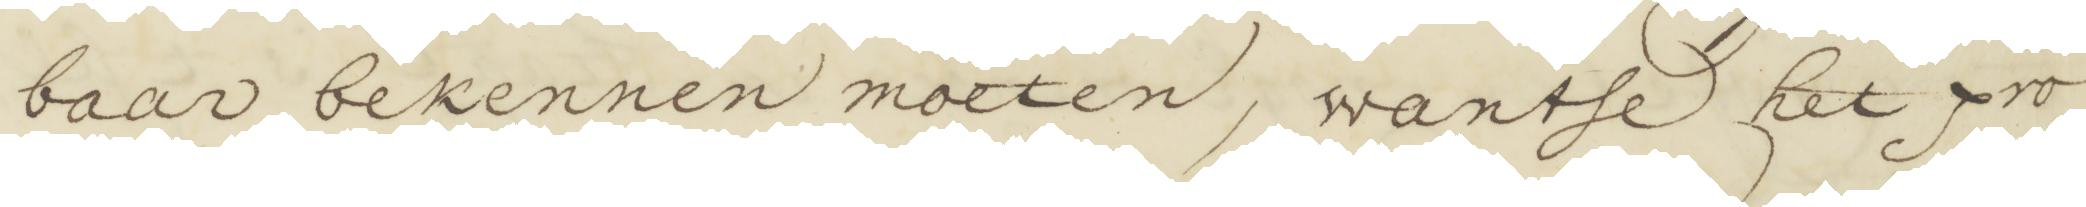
baar bekennen moeten, wantse het pro
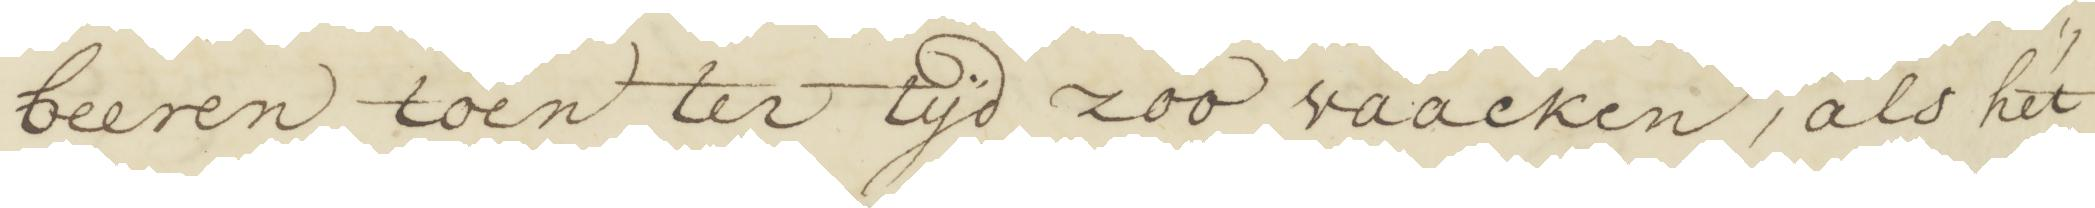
beeren toen ter tijd zoo vaacken, als het
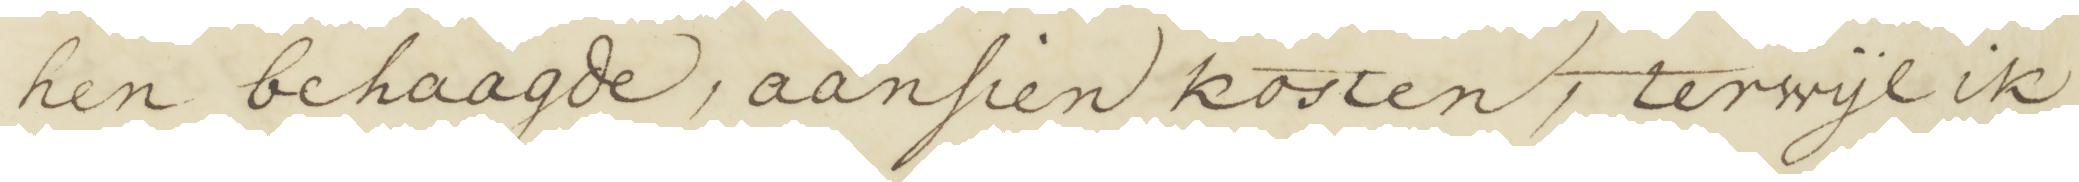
hen behaagde, aansien kosten, terwijl ik
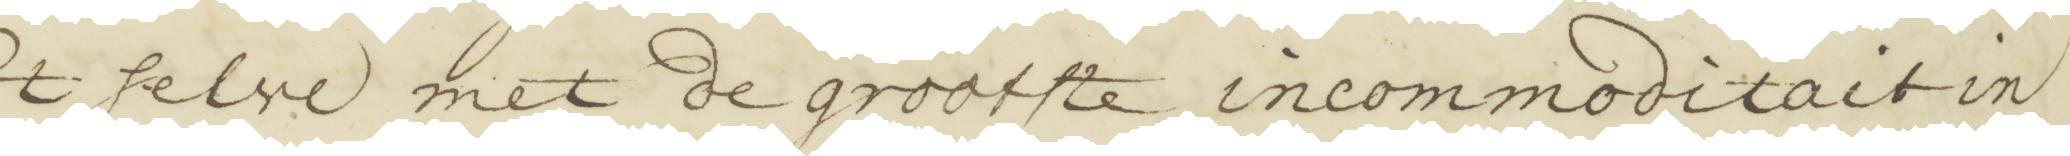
't selve met de grootste incommoditait in
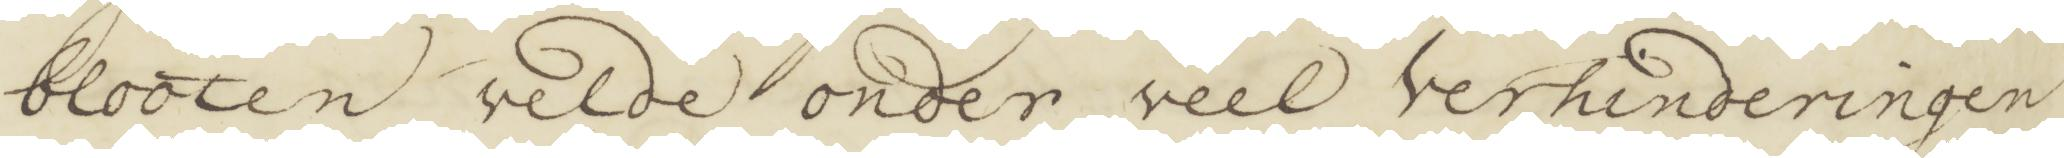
blooten velde onder veel verhinderingen
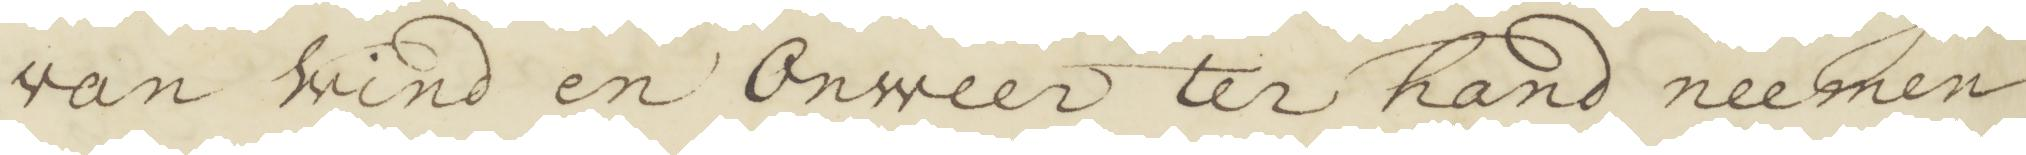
van wind en onweer ter hand neemen
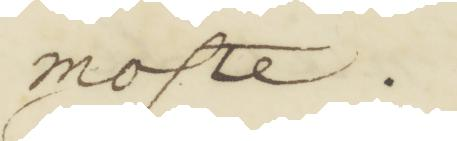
moste.
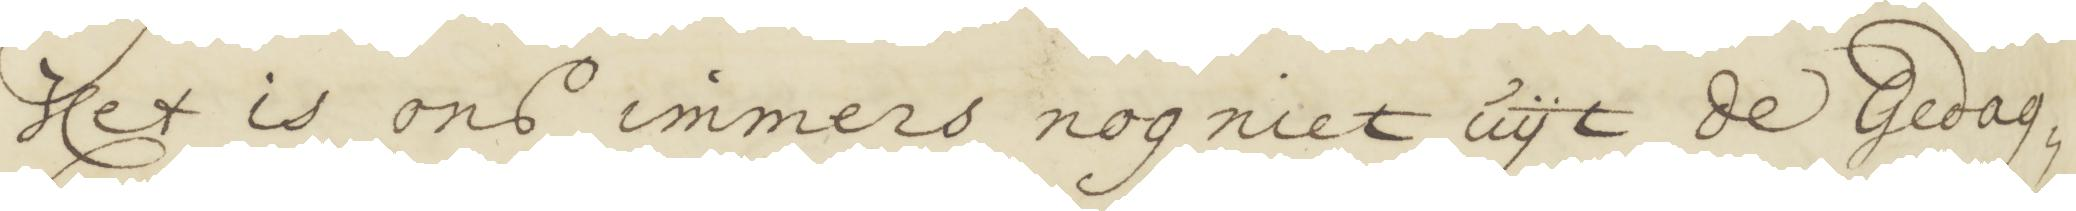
Het is ons immers nog niet uijt de Gedag„
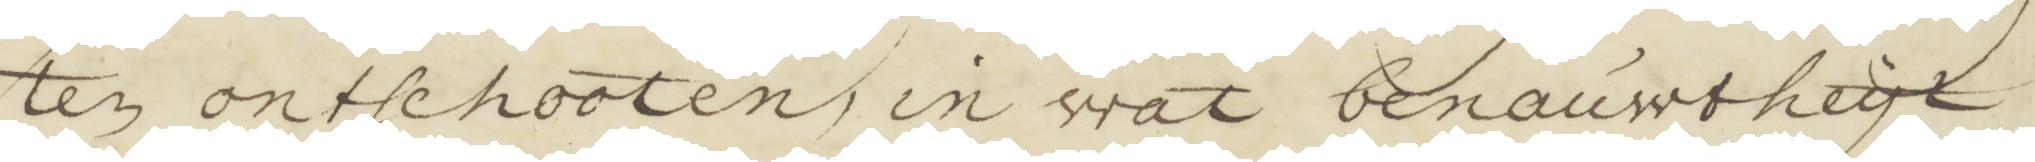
ten ontschooten, in wat benauwtheijt
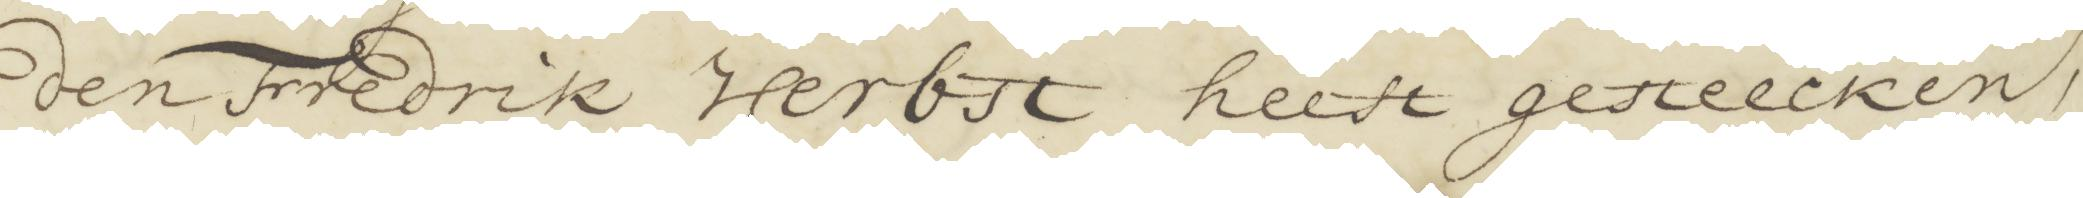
den Fredrik Herbst heeft gesteecken,
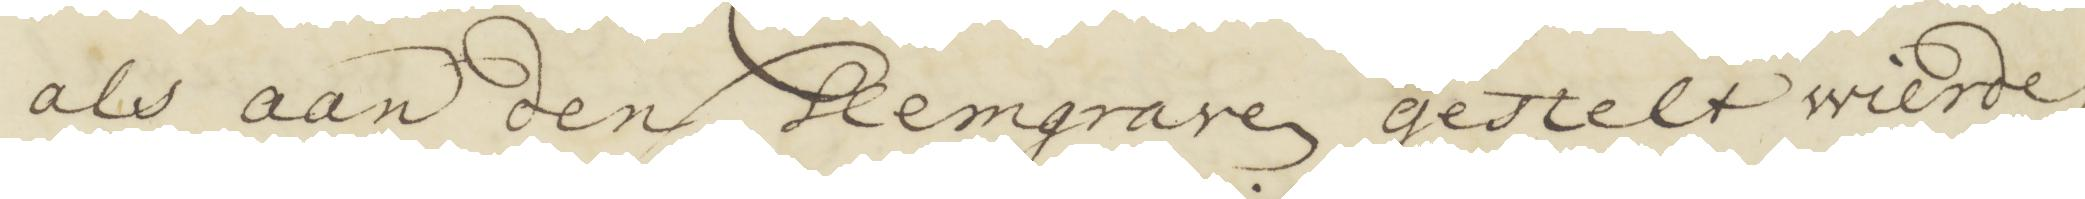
als aan den slemgraven gestelt wierde,
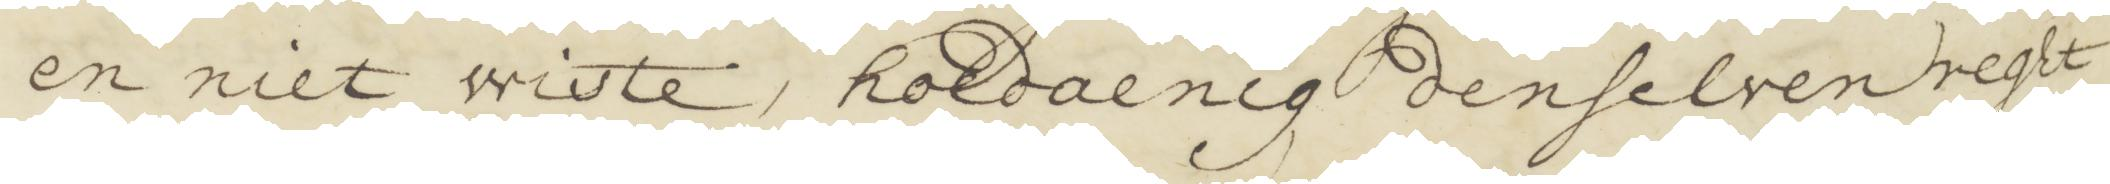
en niet wiste, hoedaenig denselven reght
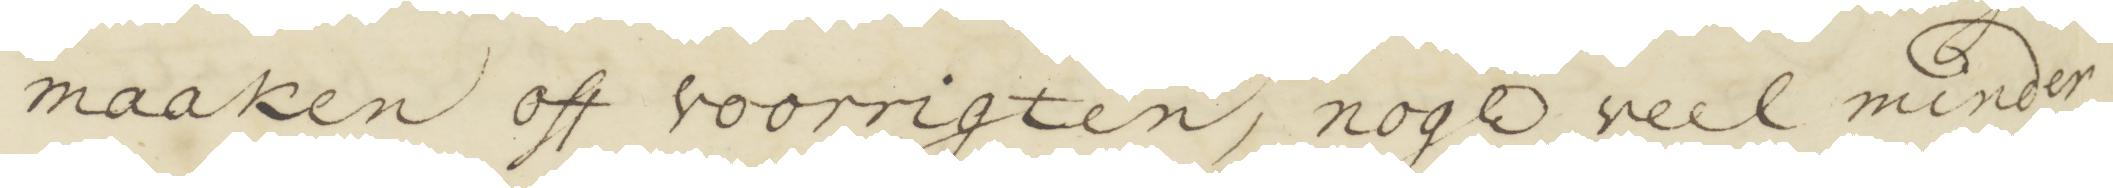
maaken oft voorrigten, nogh veel minder
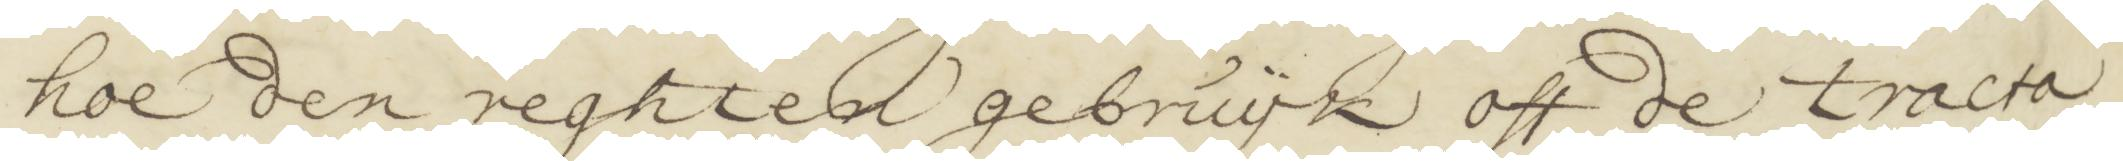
hoe den reghten gebruijk oft de tracta
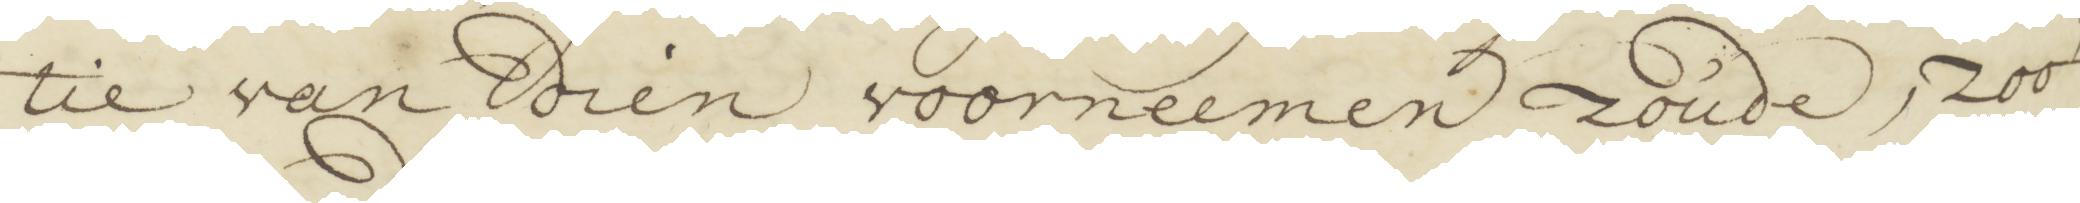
tie van dien voorneemen zoude, zoo
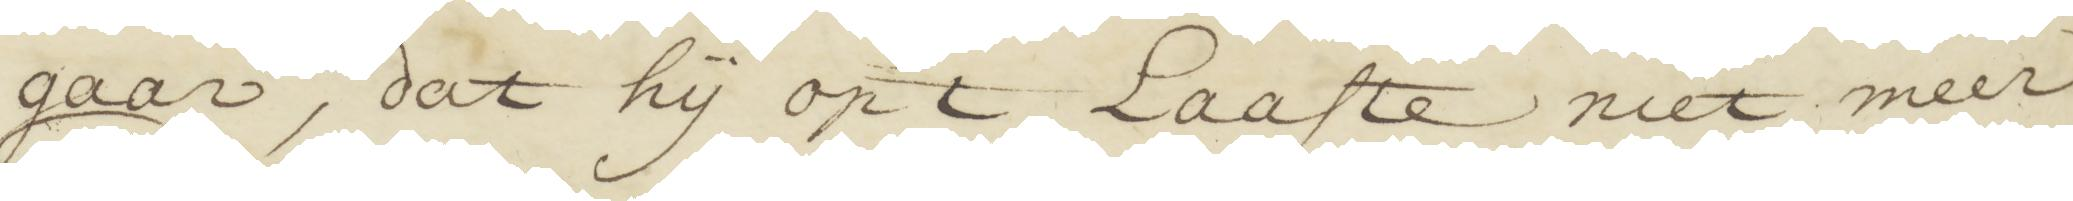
gaar, dat hij op 't Laaste niet meer
